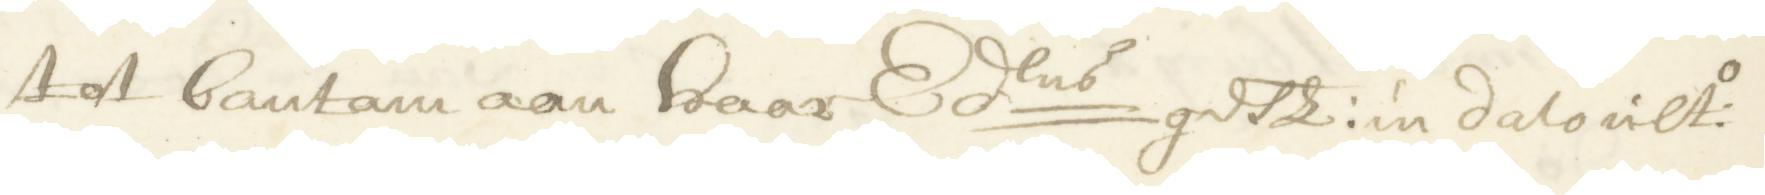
tot bantam aan haar Ed=lns gesz: in dato ult:o
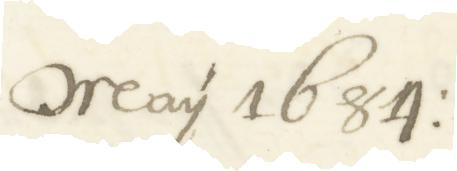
Maij 1684:
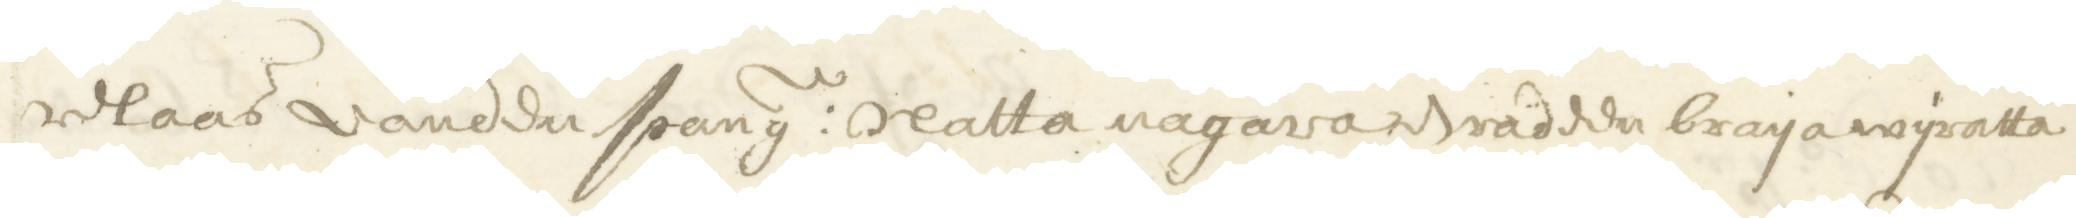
relaas van den pang: Natta nagara en radeen braija wijratta
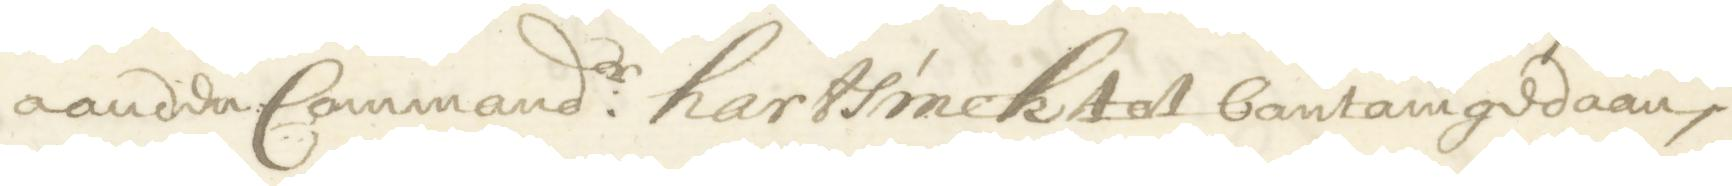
aanden Command:r hartsinck tot bantam gedaan,
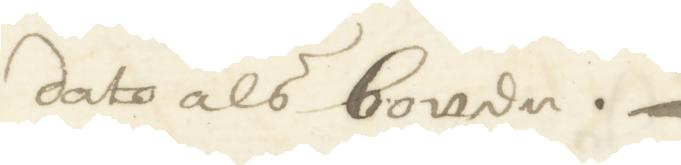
dato als boven. —
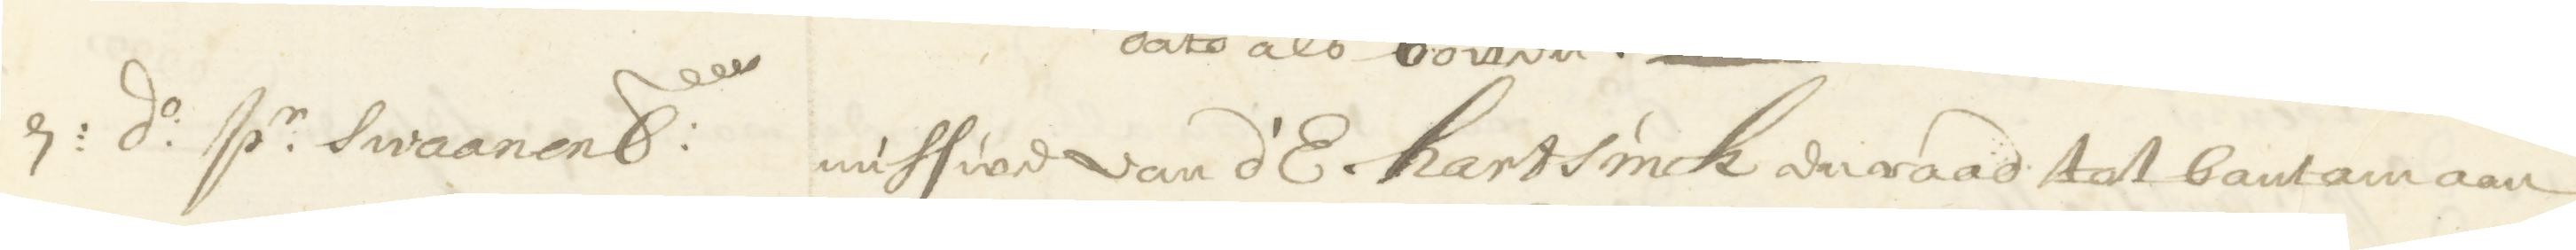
7: d:o p.r swaanenb: missive van d'E hartsinck en raad tot bantam aan
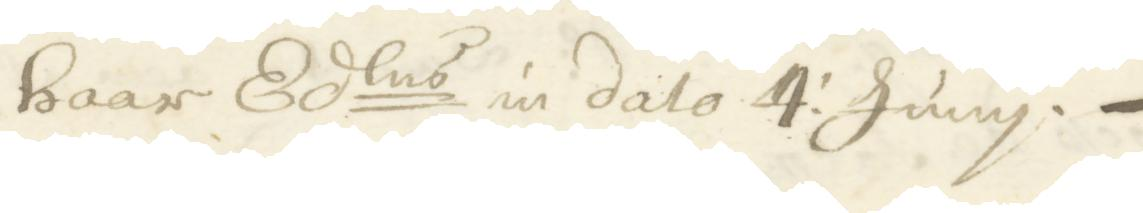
haar Ed=lns in dato 4: Junij. —
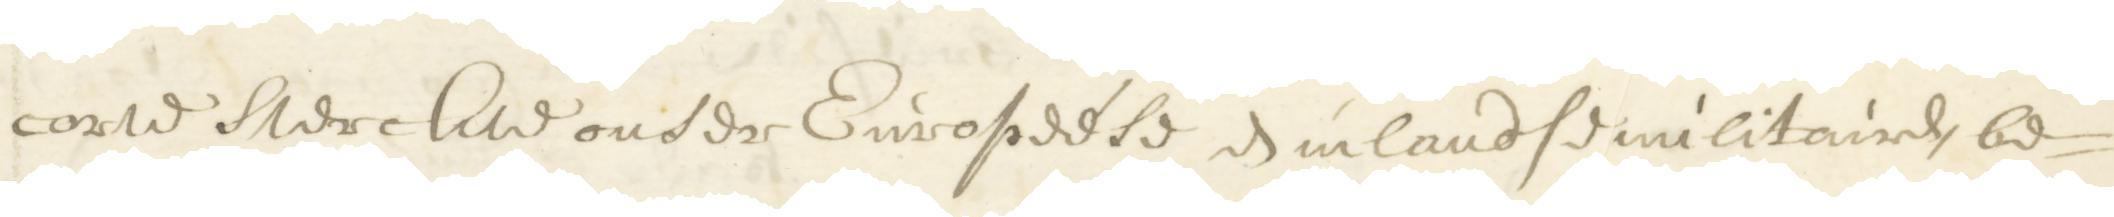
corte sterckte onser Europeese en inlandse militairen, be=
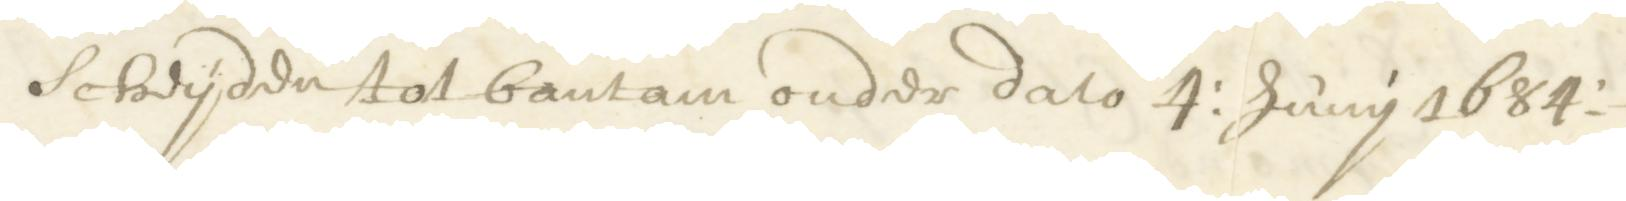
scheijden tot bantam onder dato 4: Junij 1684:
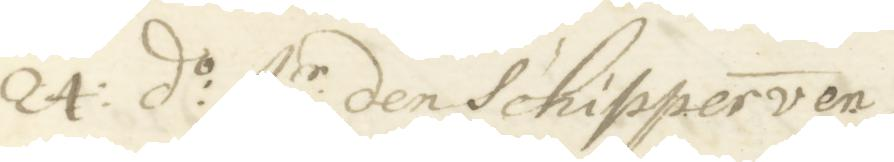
24. d:o p:r den schipper van.
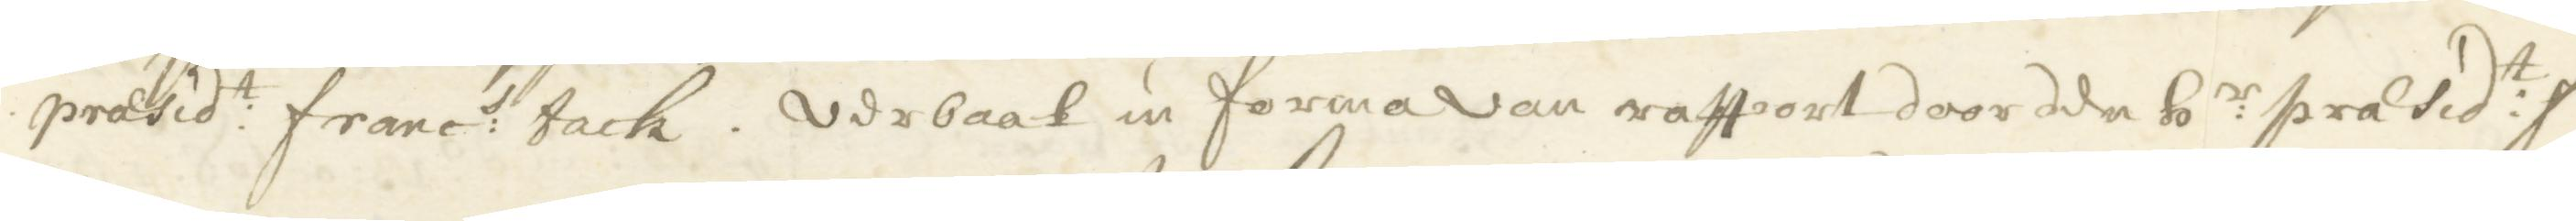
praesid:t Franc:s tack. verbaal in forma van rapport door den h:r praesid:t f
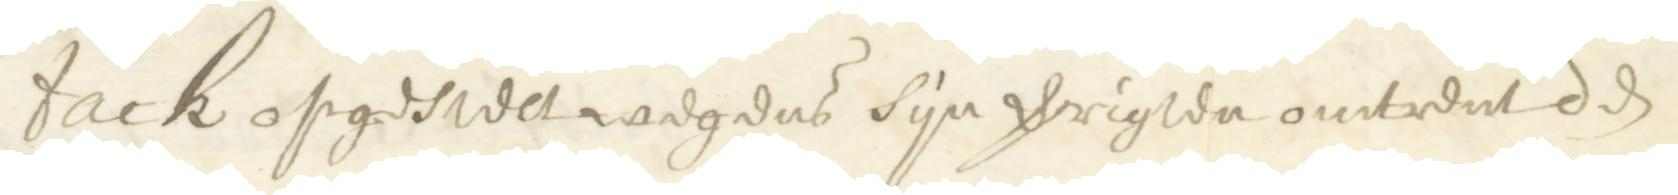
tack opgestelt wegens sijn verrigten omtrent den
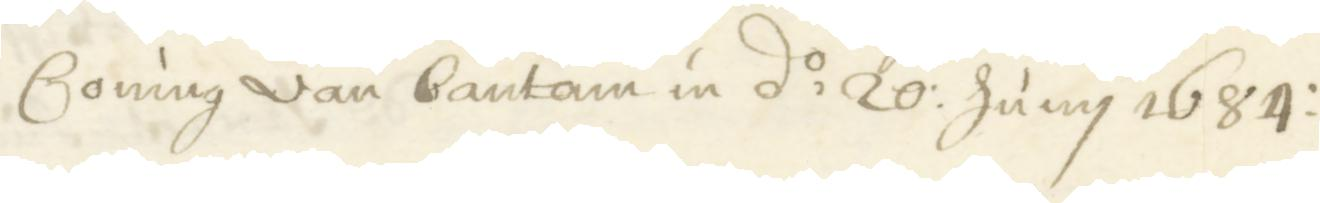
Coning van bantam in d:o 20: Junij 1684:
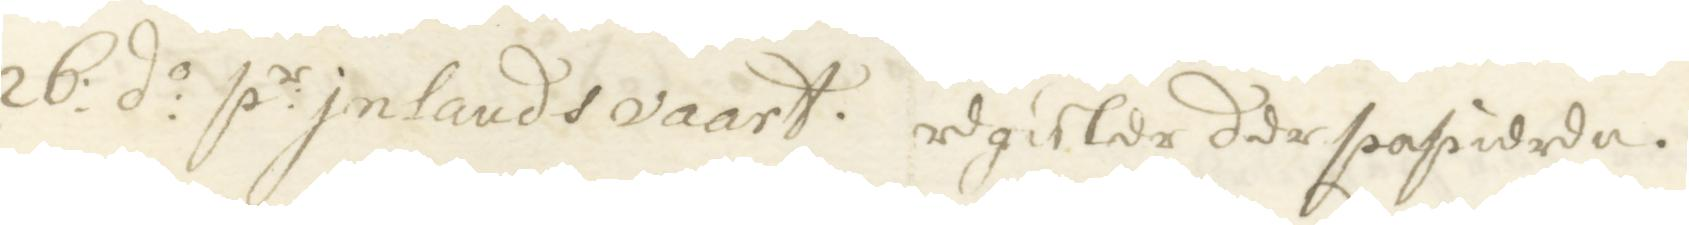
26. d:o p:r jnlands vaart. register der papieren.
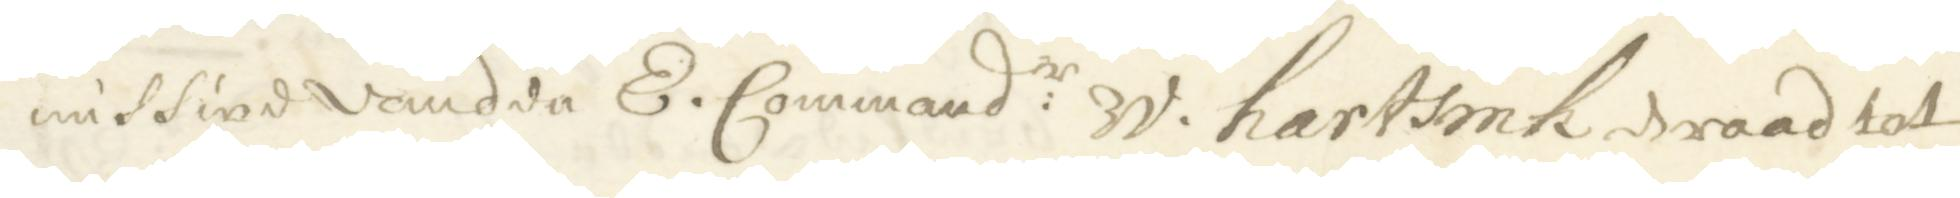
missive van den E. Command:r W. hartsink en raad tot
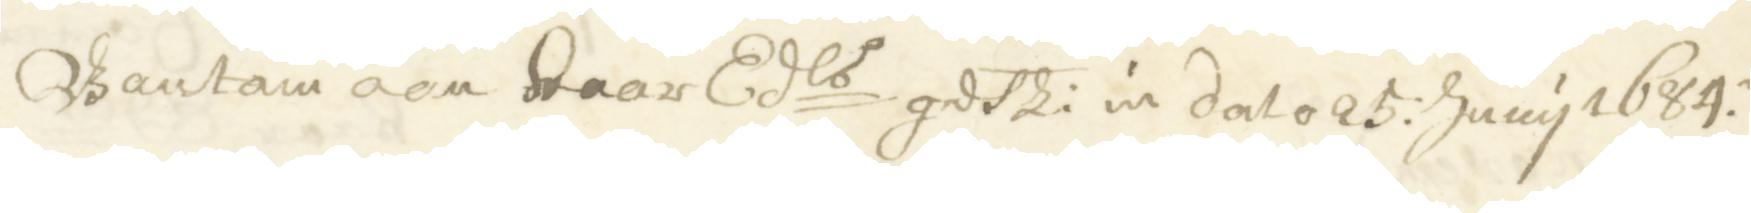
Bantam aan daar Ed=ls gesz: in dato 25: Junij 1684:
